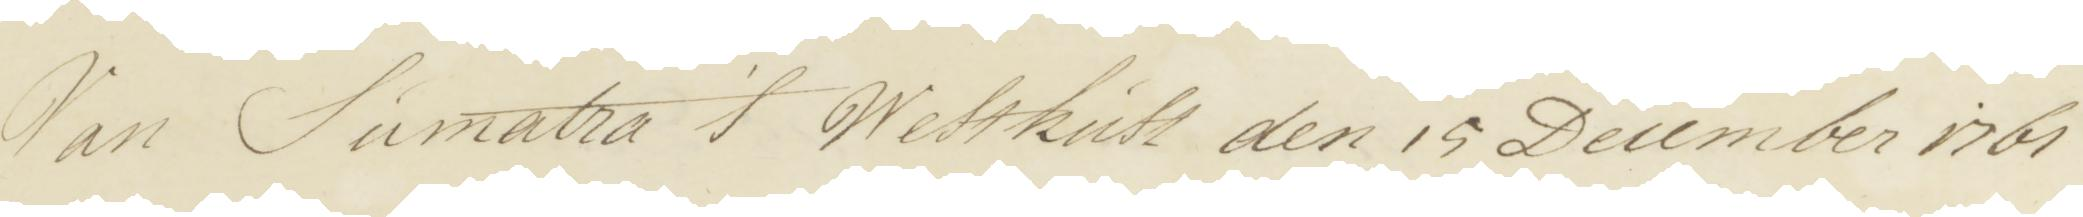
Van Sumatra's Westkust den 15 December 1761
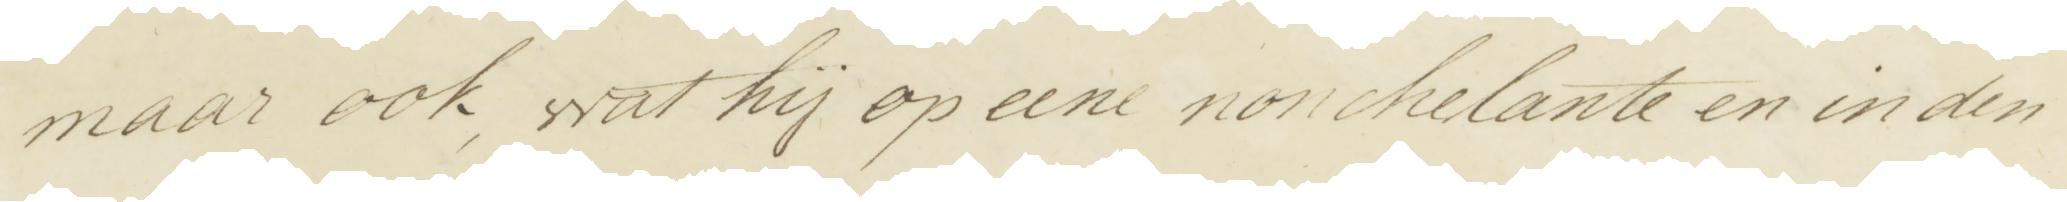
maar ook, wat hij op eene nonchelante en in den
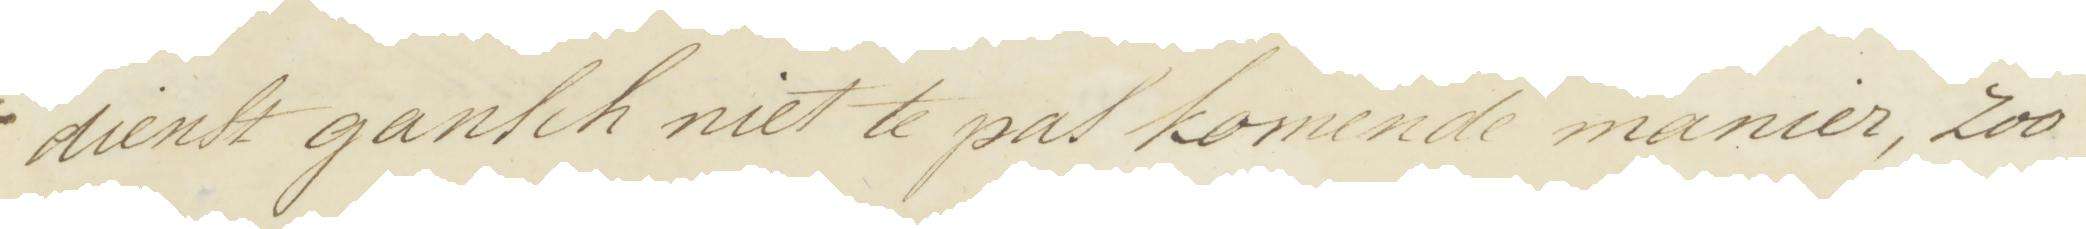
dienst gansch niet te pas komende manier, zoo
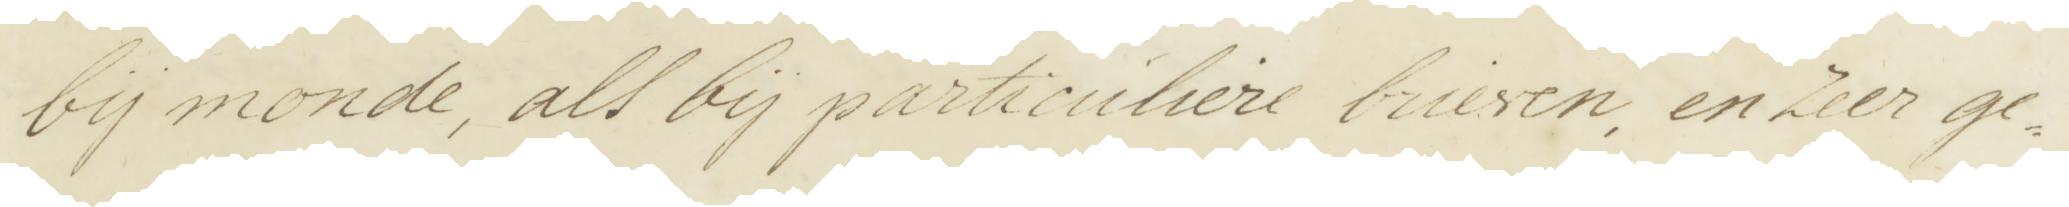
bij monde, als bij particuliere brieven, en zeer ge„
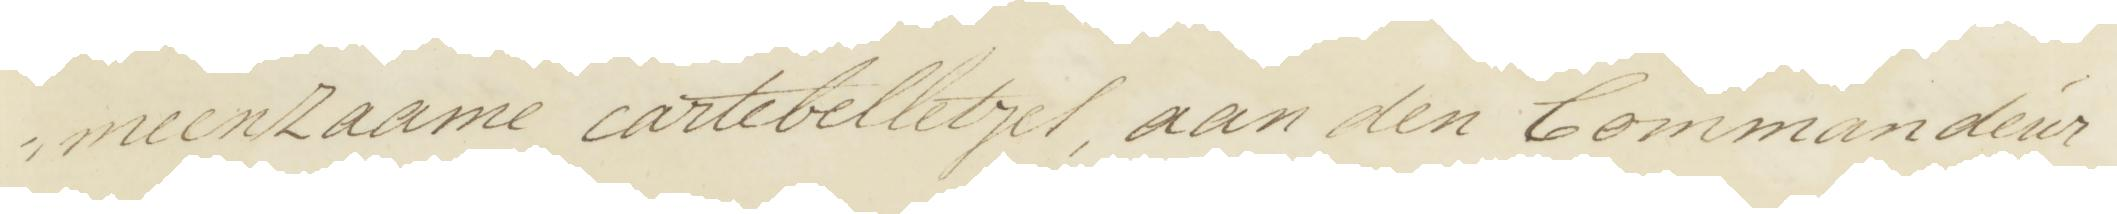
„meenzaame cartebelletjes, aan den Commandeur
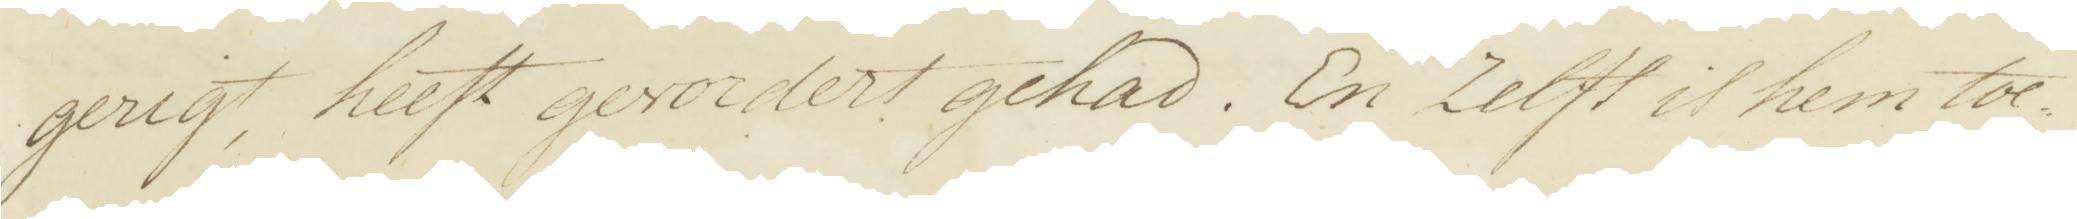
gerigt, heeft gevordert gehad. En zelft is hem toe„
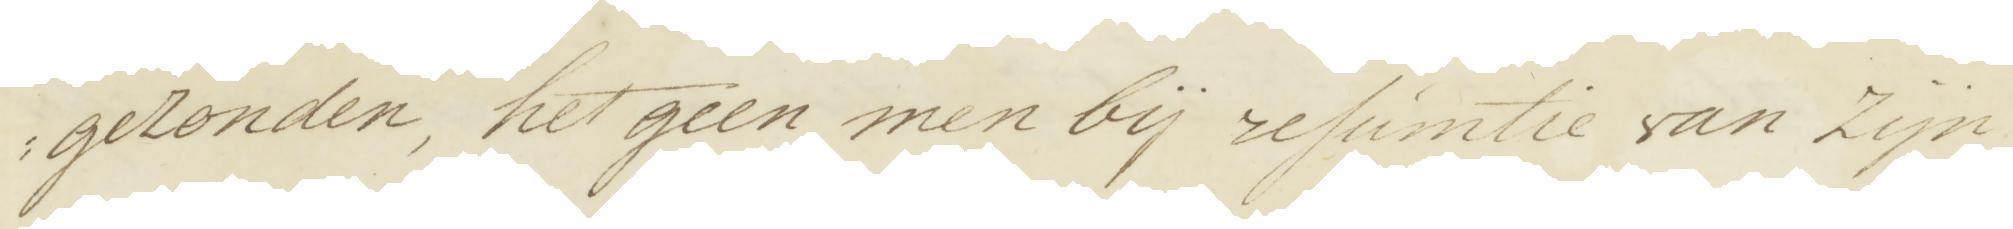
„gezonden, het geen men bij resumtie van zijn
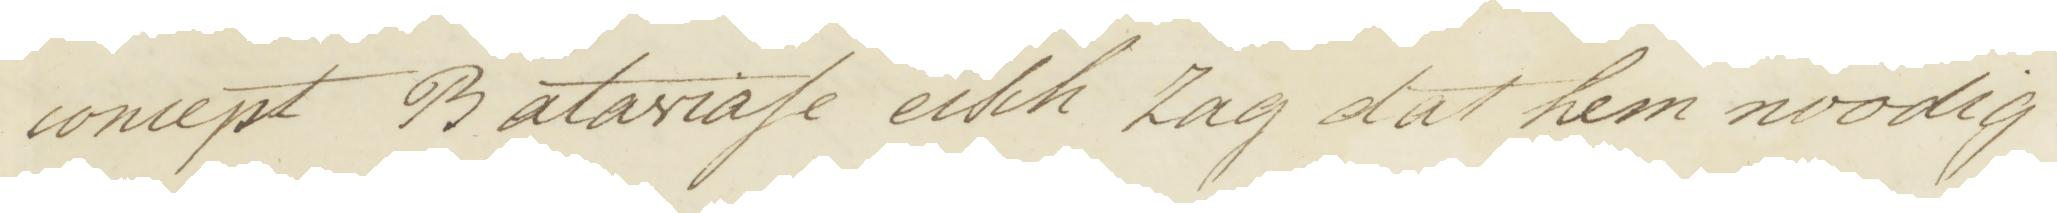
concept Bataviase eisch zag dat hem noodig
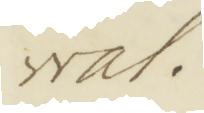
was.
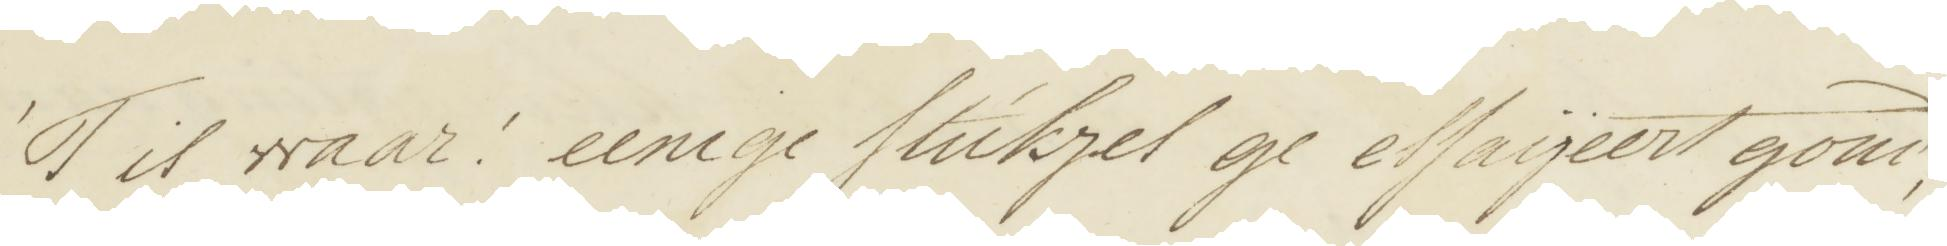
'T is waar; eenige stukjes ge essaijeert goud,
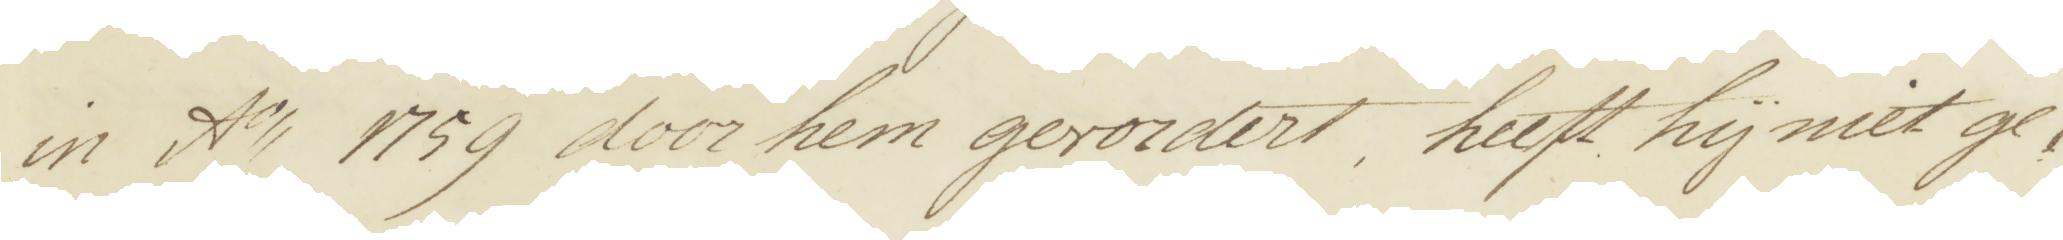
in A„o 1759 door hem gevordert, heeft hij niet ge„
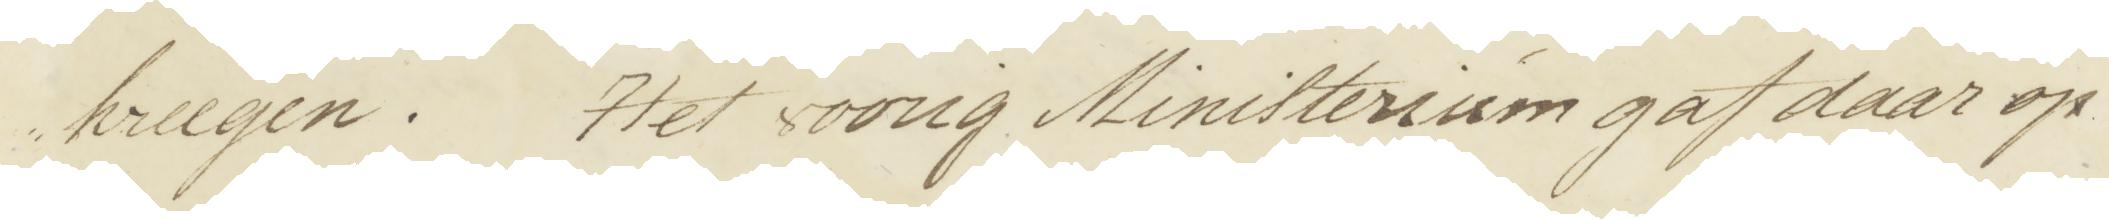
„kreegen. Het voorig Ministerium gaf daar op
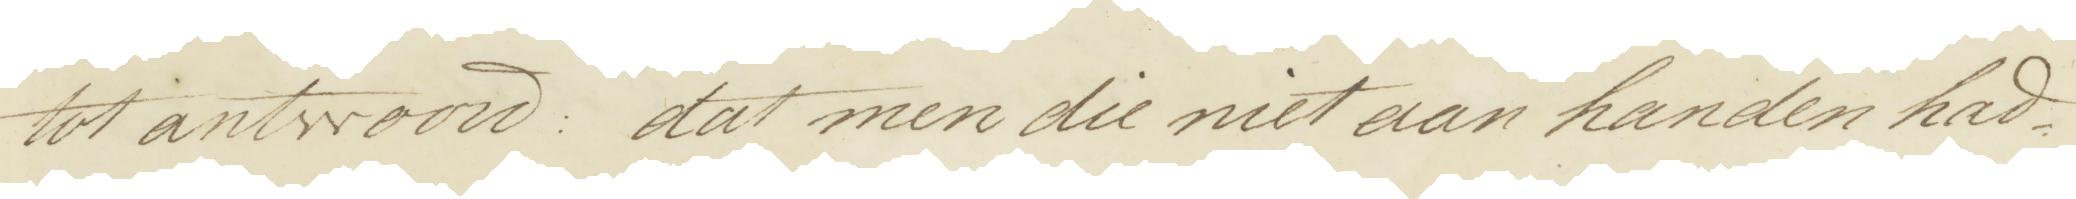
tot antwoord: dat men die niet aan handen had„
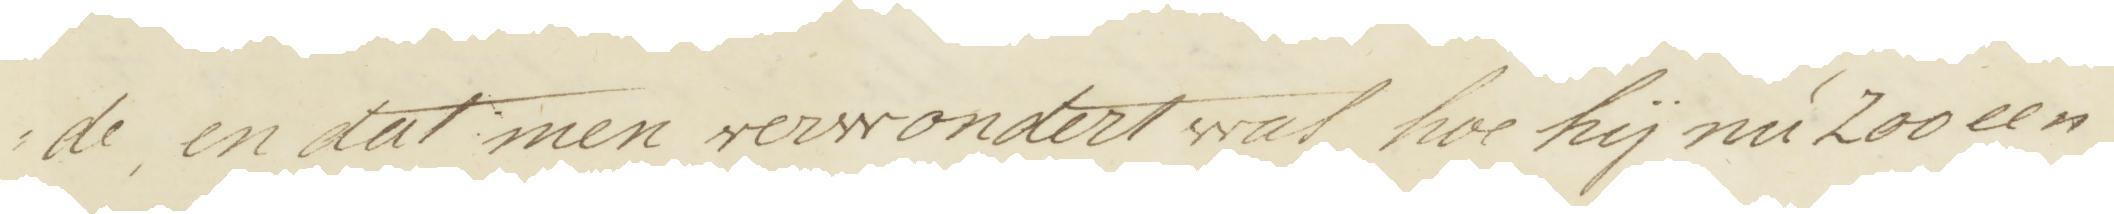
„de, en dat men verwondert was, hoe hij nu zoo een
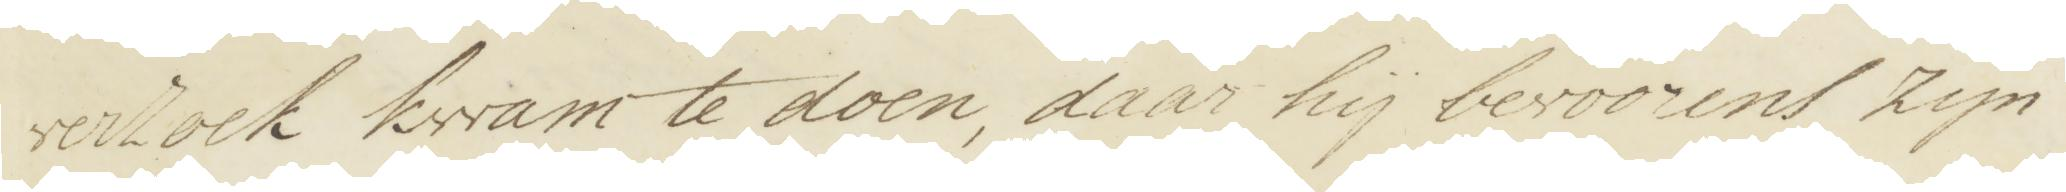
verzoek kwam te doen, daar hij bevoorens zijn
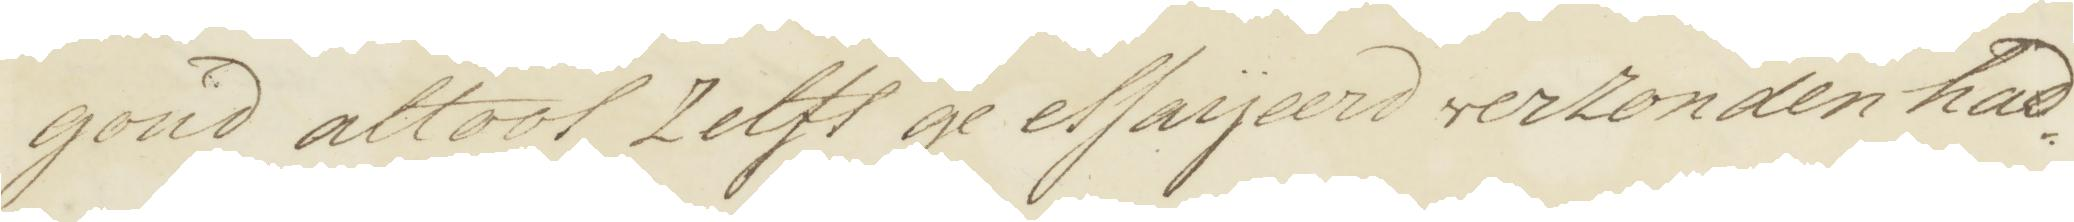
goud altoos zelft ge essaijeerd verzonden had„
